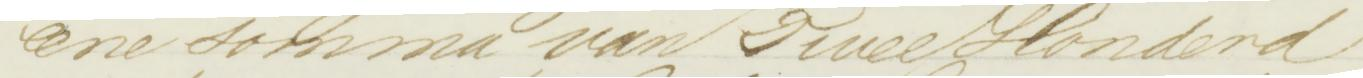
eene somma van Twee Honderd
